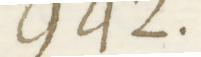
942.
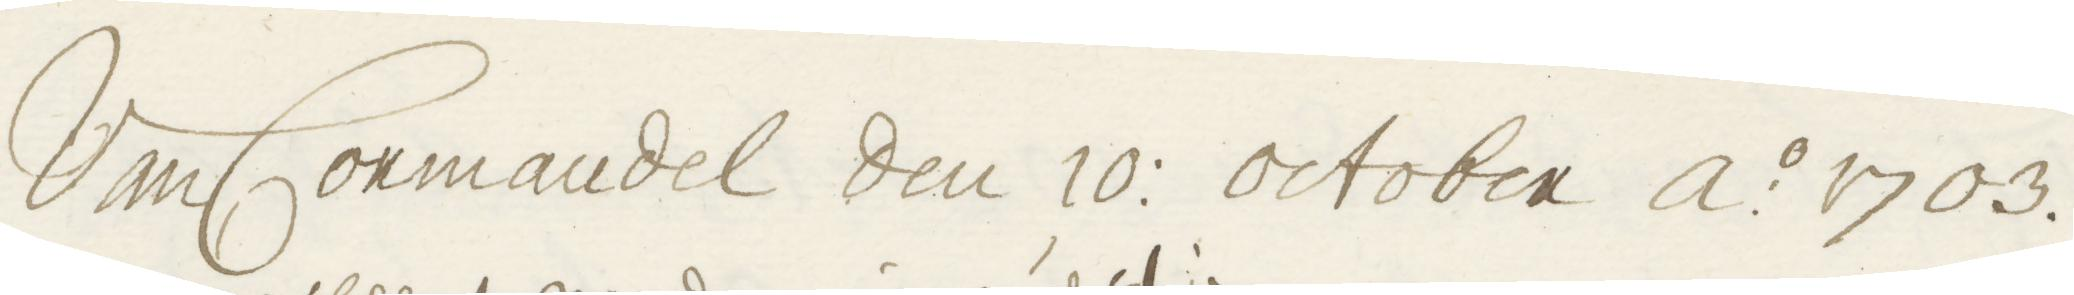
Van Cormandel den 10: october a:o 1703.
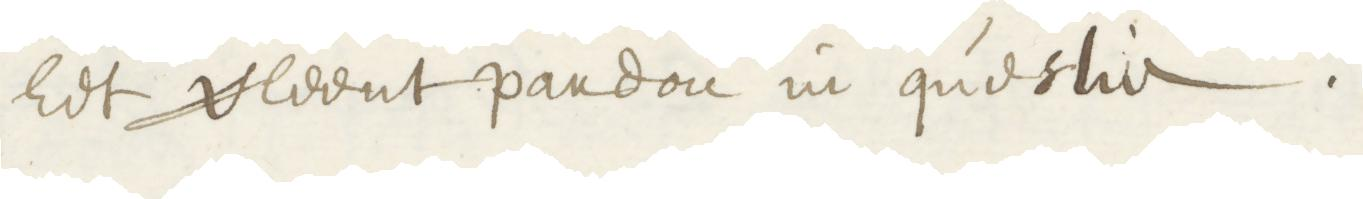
het verleent pardon in questie.
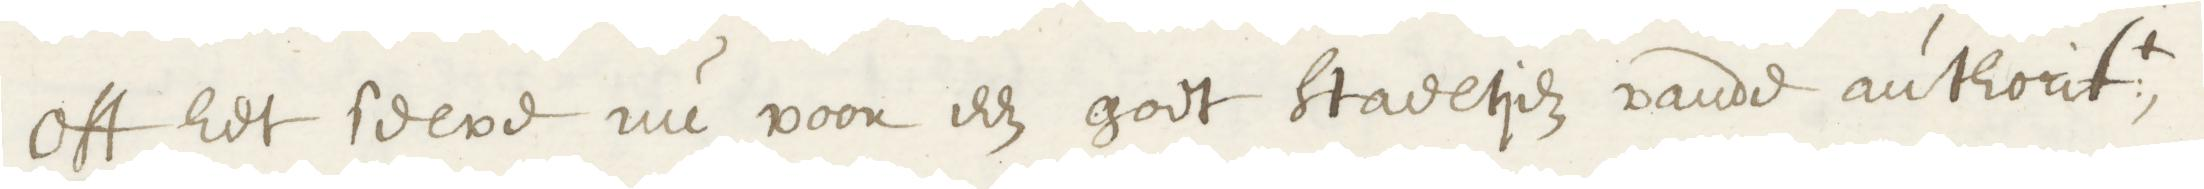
off het selve nu voor een goet staeltjen vande authorit:t,
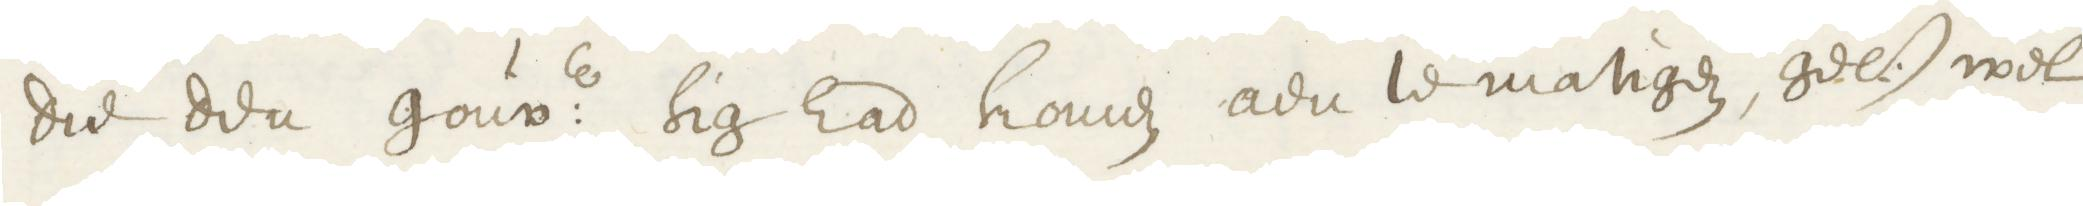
die den gouv:r sig had komen aen te matigen, gelijk wel
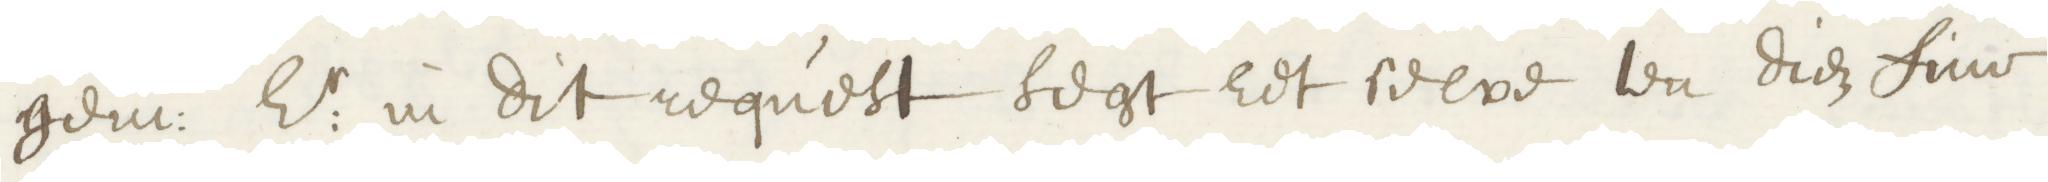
gem: h:r in dit request segt het selve ten dien sine
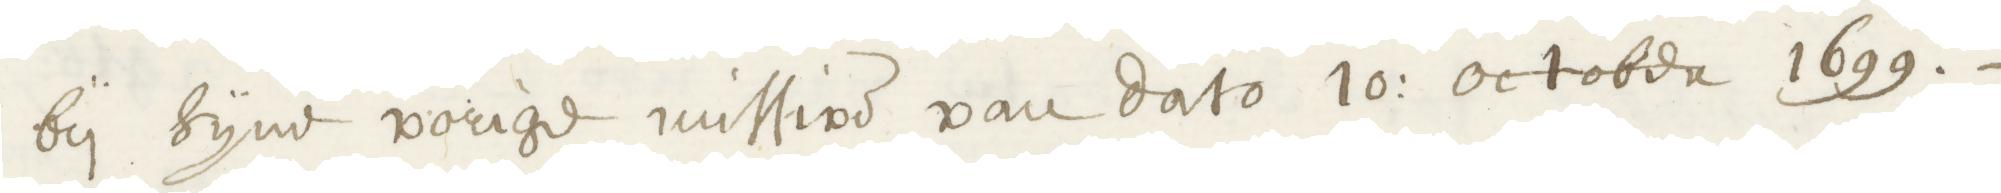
bij sijne vorige missive van dato 10: october 1699.
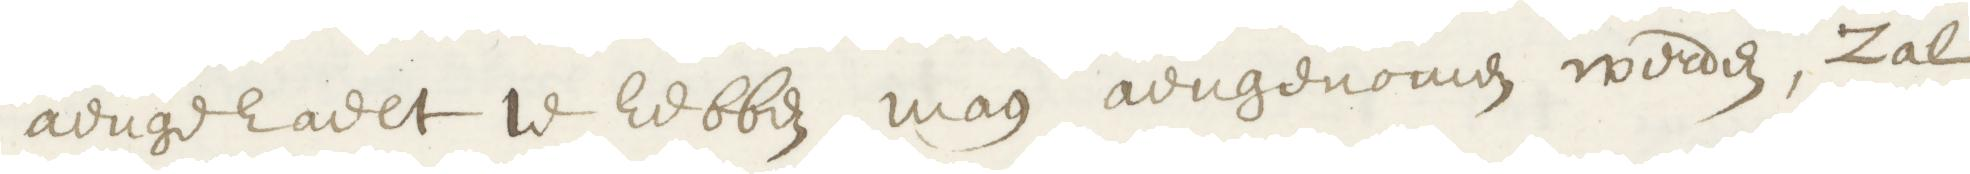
aengehaelt te hebben, mag aengenomen werden, zal
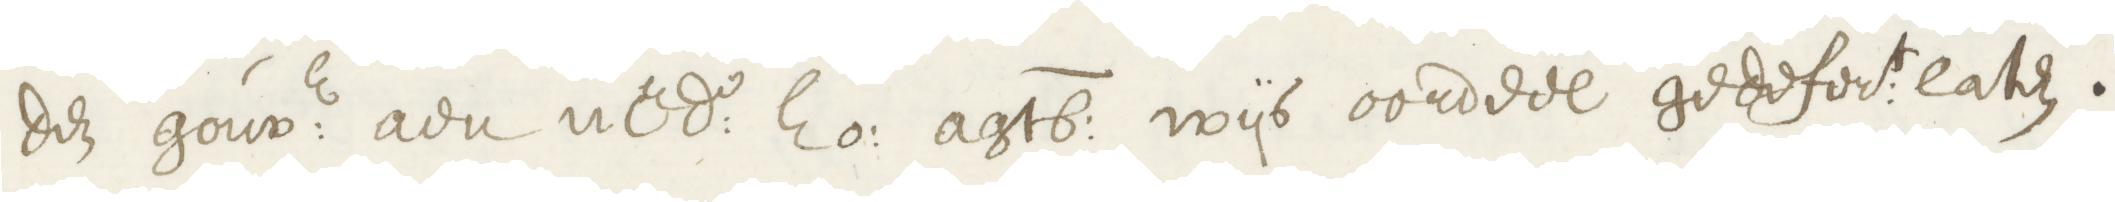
den gouv:r aen u Ed: ho: agtb: wijs oordeel gedefer:t laten.
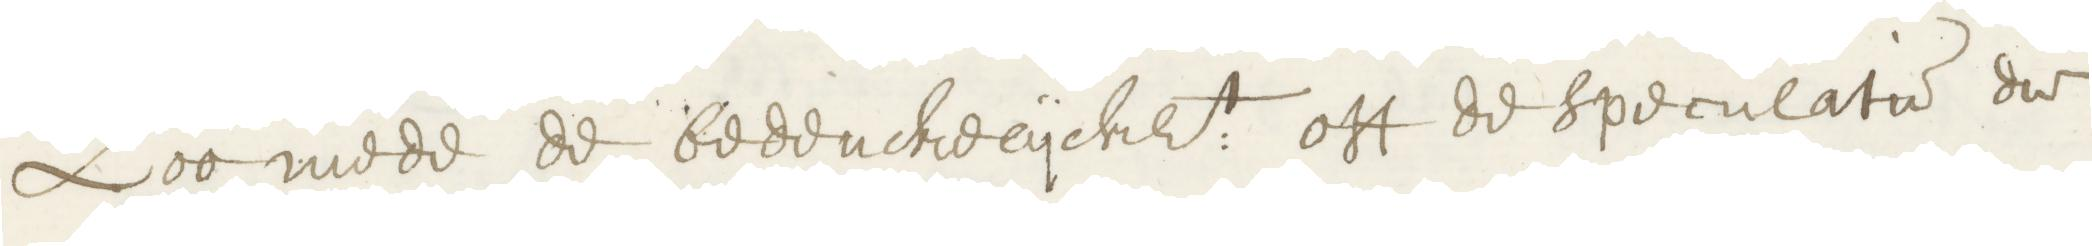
Zoo mede de bedenckelijckh:t oft de speculatie die
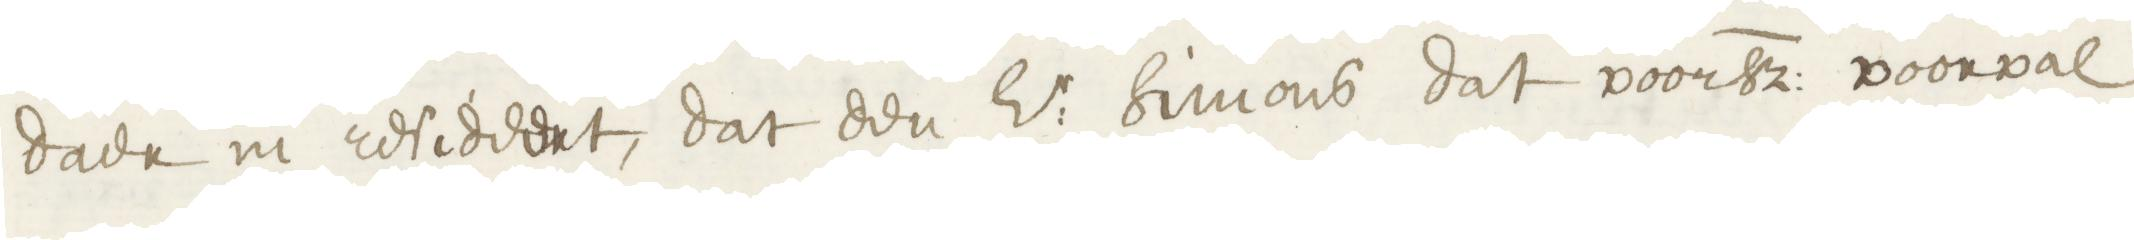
daer in resideert, dat den h:r simons dat voorsz: voorval
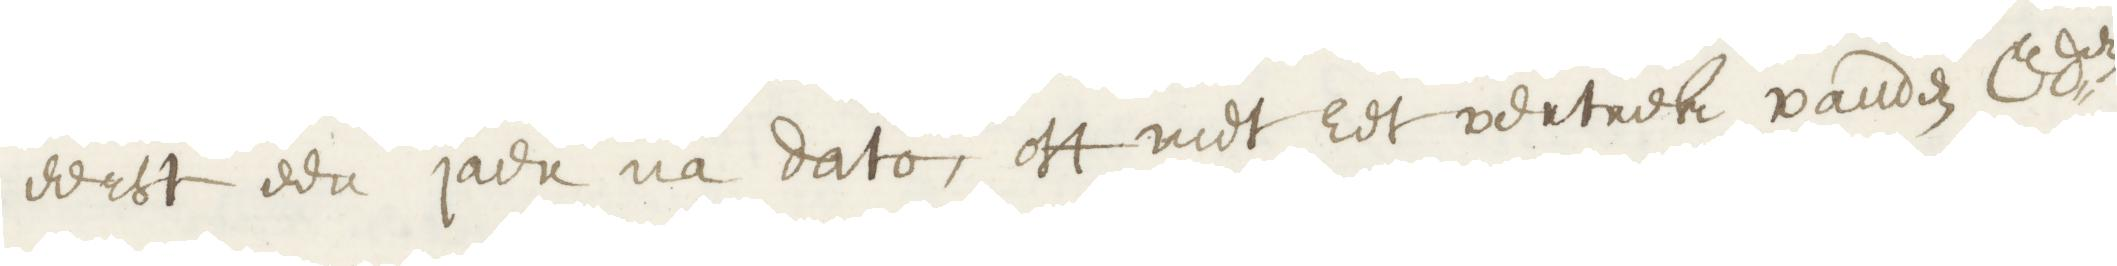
eerst een jaer na dato, off met het vertrek vanden Ed„en
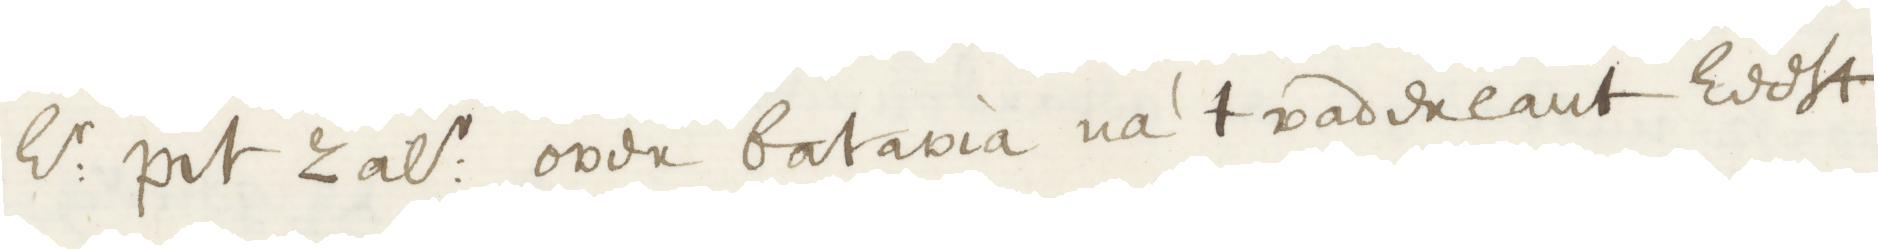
h:r pit zal:r over batavia na ’t vaderlant heeft
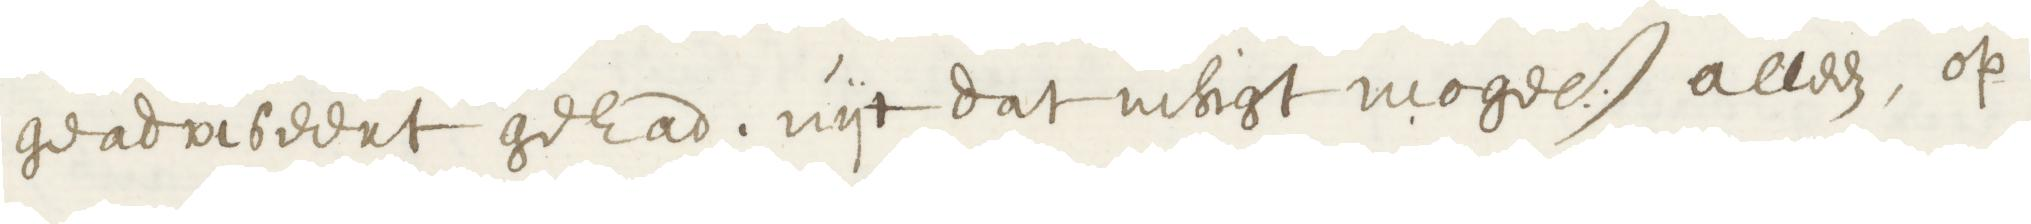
geadviseert gehad. uijt dat insigt mogelijk alleen, op
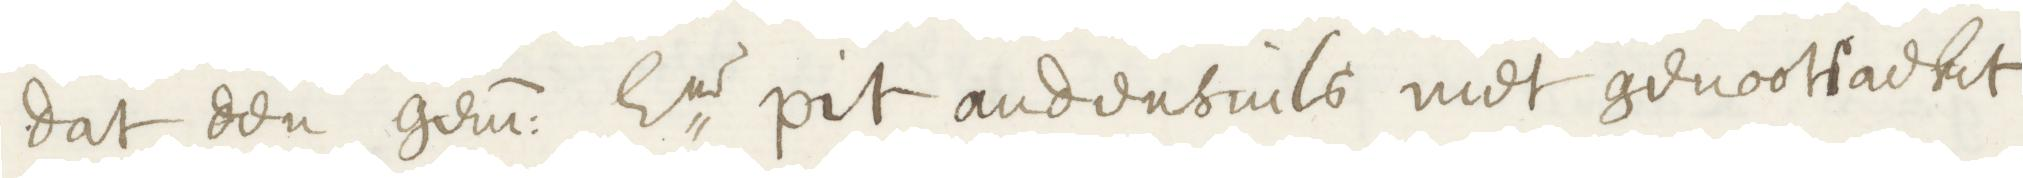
dat den gem: h„r pit andersints niet genootsaekt
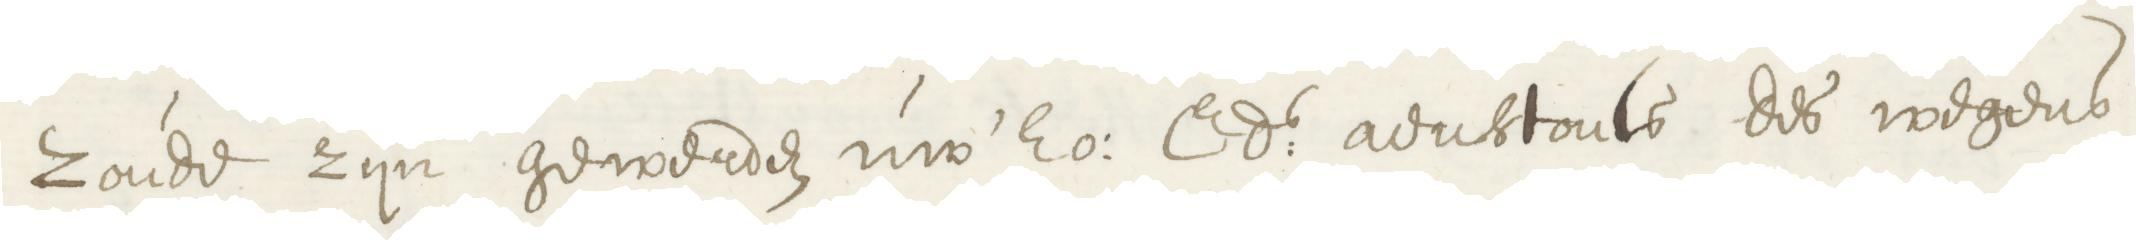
zoude zijn gewerden uw' ho: Ed:s aenstonts des wegens
